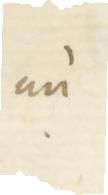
nu
